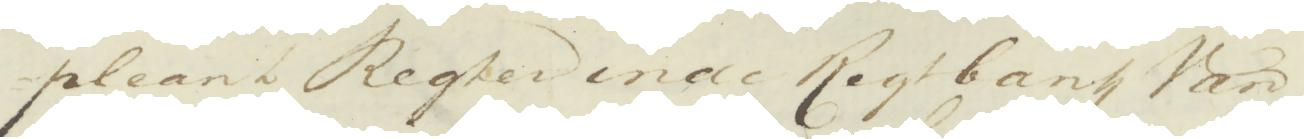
=pleant Regter in de Regtbank van
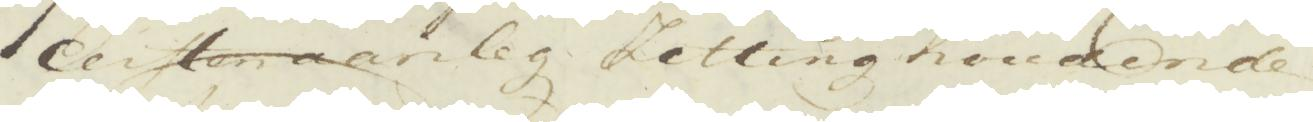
Eersten aanleg zitting houdende
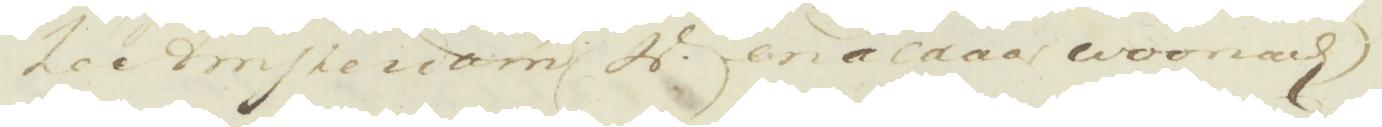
te Amsterdam V.en en aldaar woonach
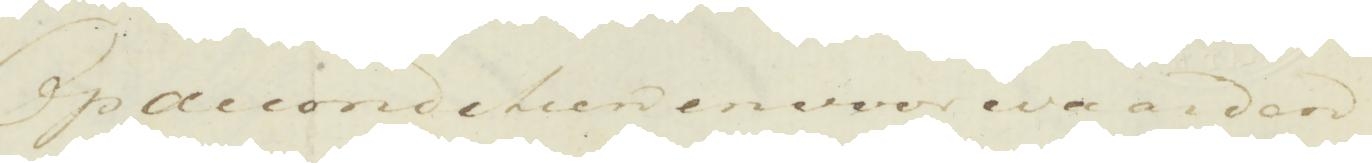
Op de conditien en voor waarden
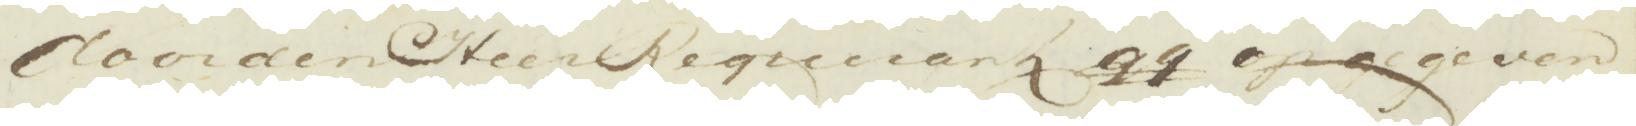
door den Heer Requirant qq opgegeven
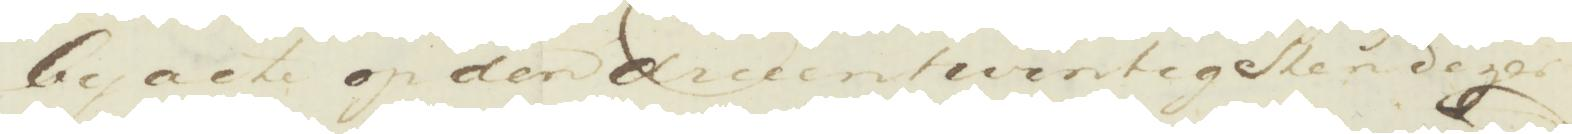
by acte op den drieentwintigsten dezes
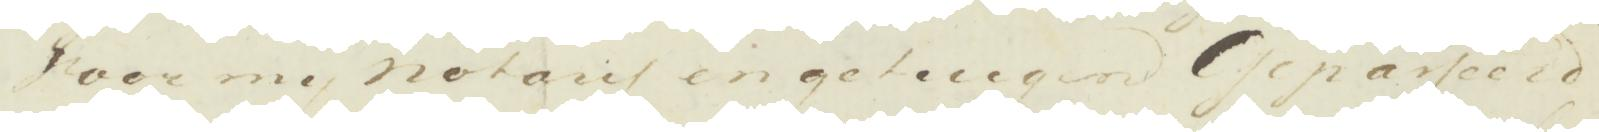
Voor my notaris en getuigen Gepasseerd,
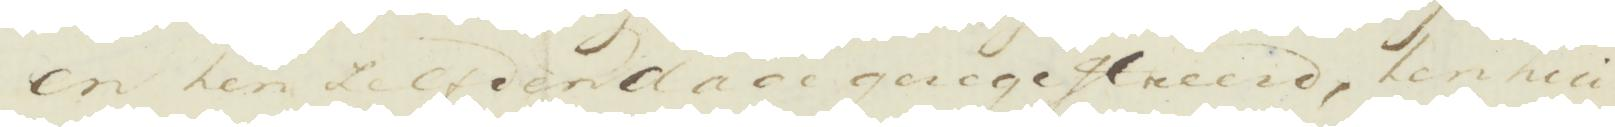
en ten zelfden dage geregistreerd, ten hui
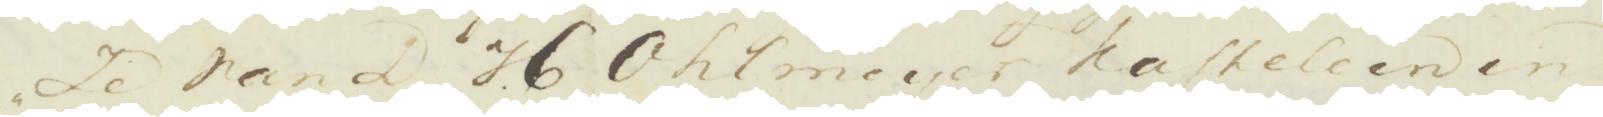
„ze van D H Ohlmeyer kastelein in
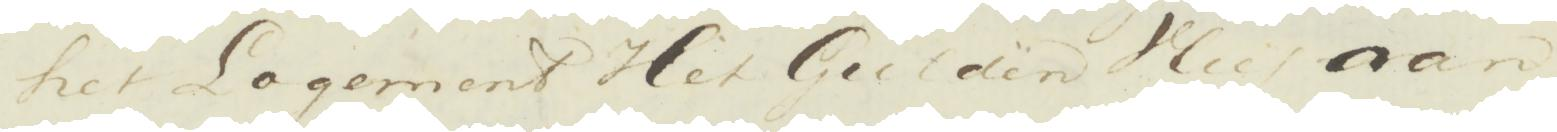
het Logement Het Gulden Vlies aan
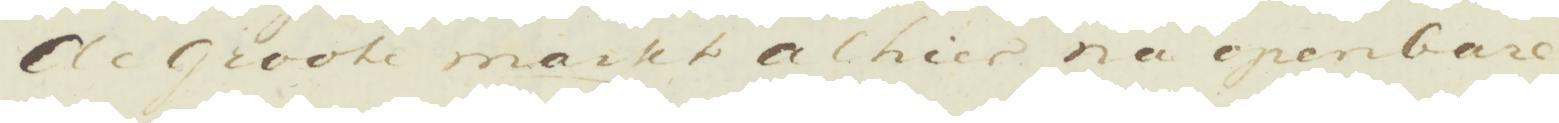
de groote markt alhier na openbare
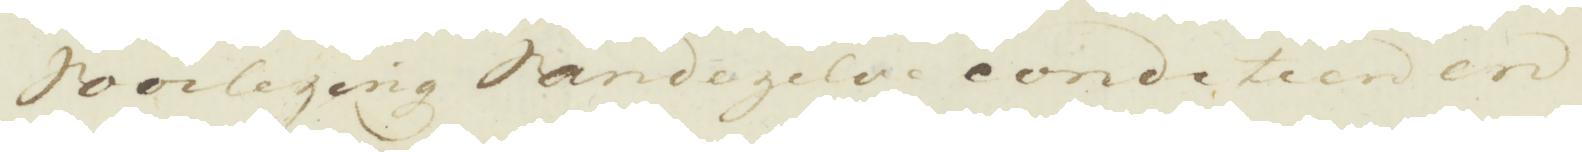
voorlezing van dezelve conditien en
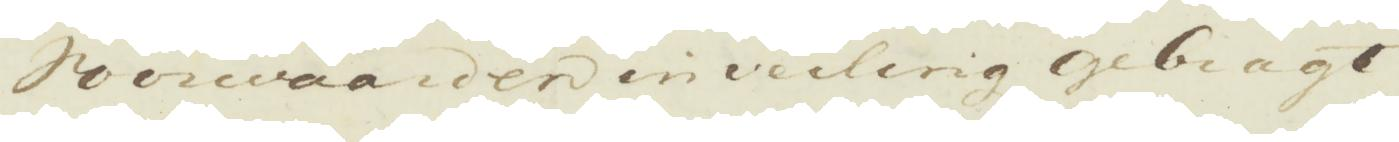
voorwaarden in veiling gebragt
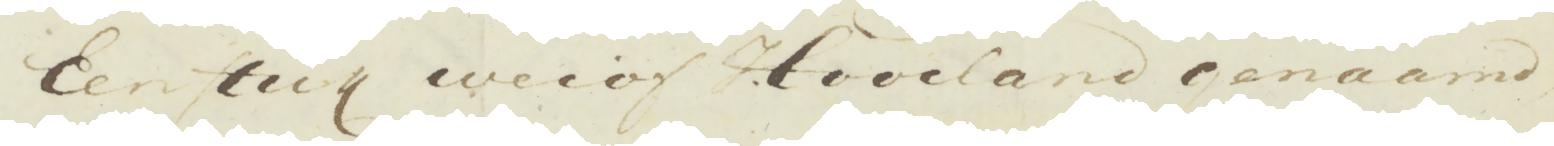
Een stuk wei of Hooiland genaamd
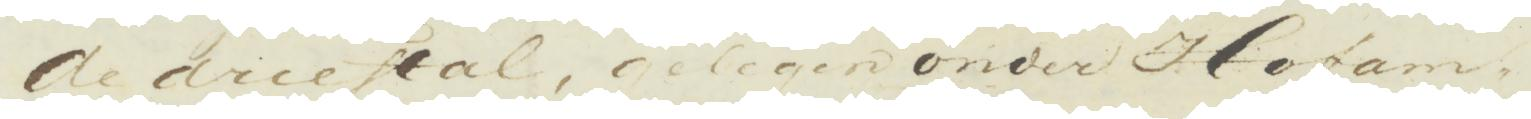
de driestal, gelegen onder Hofam„
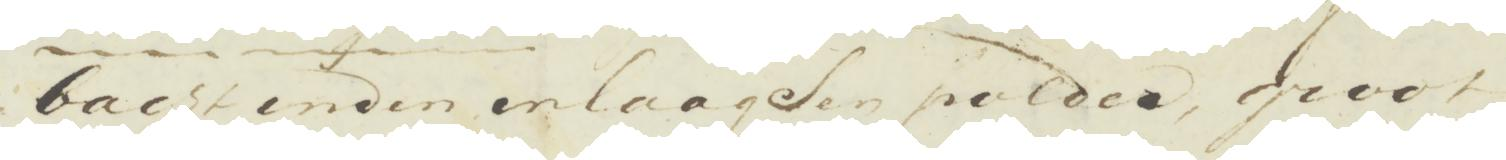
bacht enden inlaagsen polder, groot
